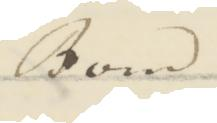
Bom
